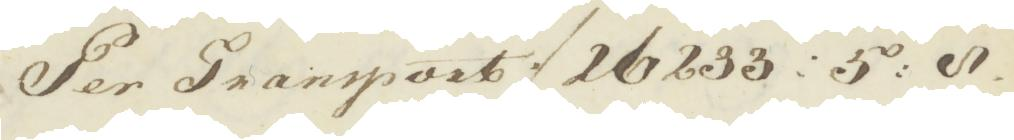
Per Transport ƒ 26233: 5: 8.
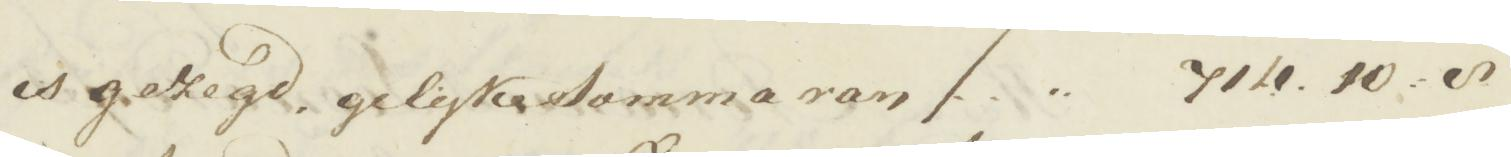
is gezegd, gelyke somma van - - „ 714. 10: 8
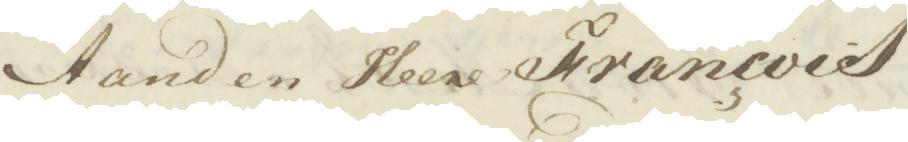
Aan den Heere François
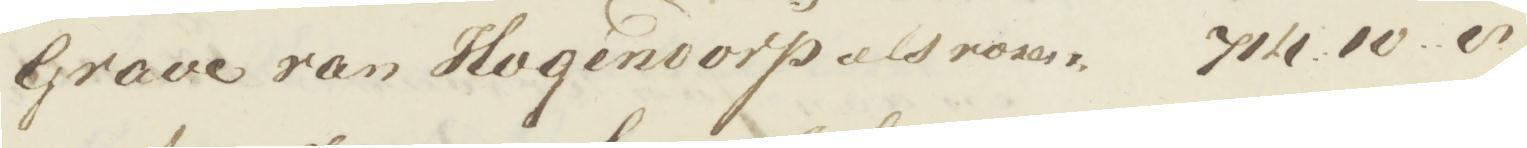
Grave van Hogendorp als voren 714: 10: 8
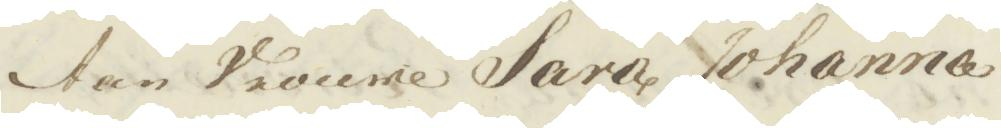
Aan Vrouwe Sara Johanna
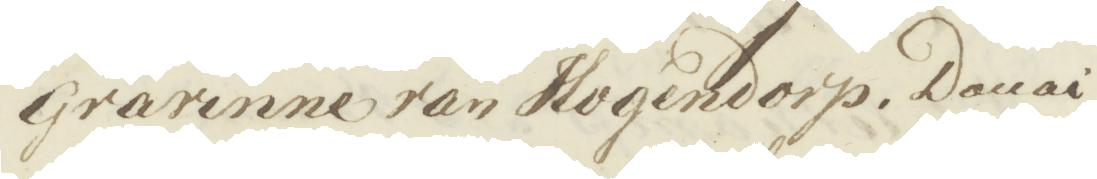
Gravinne van Hogendorp, Douai
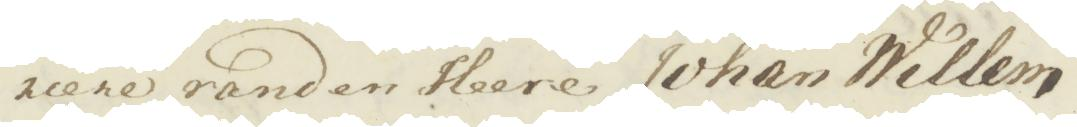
ziere van den Heere Johan Willem
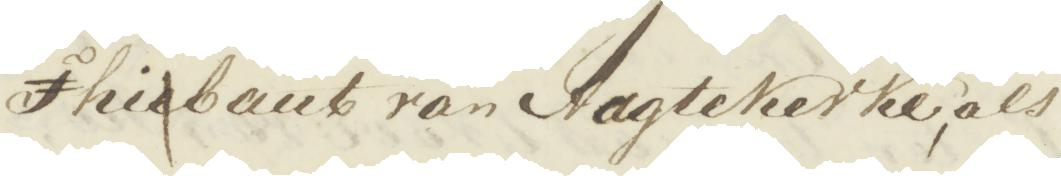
Thiebaut van Aagtekerke, als
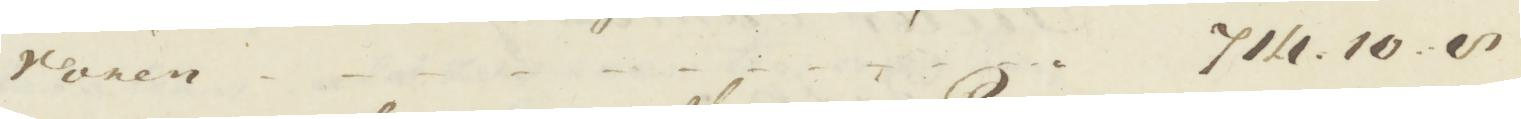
Voren - - - - - - - - - - - - - 714. 10: 8
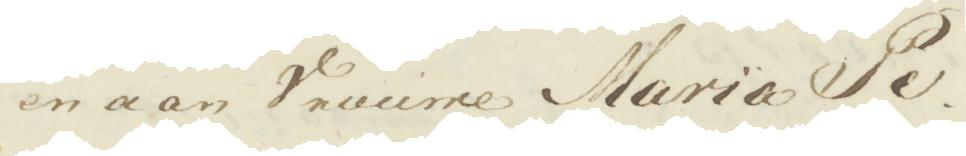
en aan Vrouwe Maria Pe,
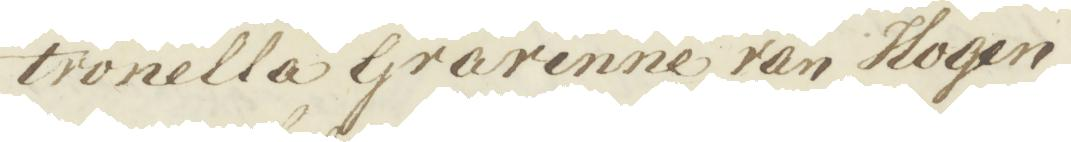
tronella Gravinne van Hogen,
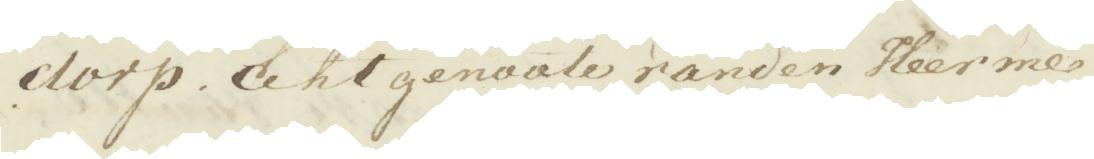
dorp, Echtgenoote van den Heer me
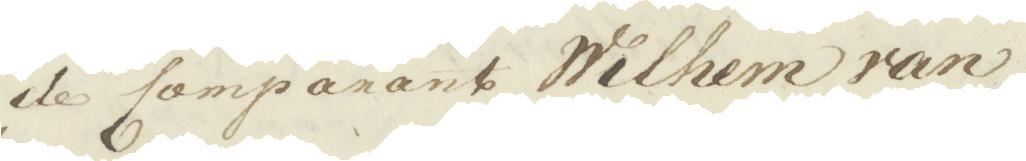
de Comparant Wilhem van
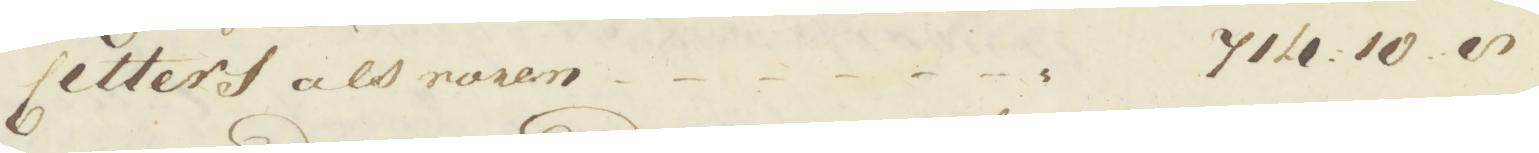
Citters als voren - - - - - - „ 714: 10: 8
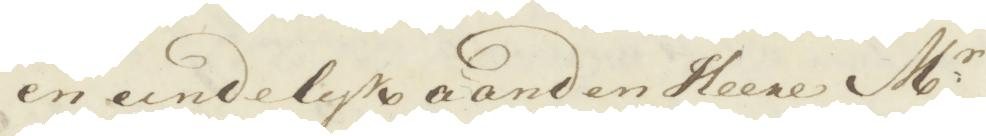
en eindelyk aan den Heere M:r
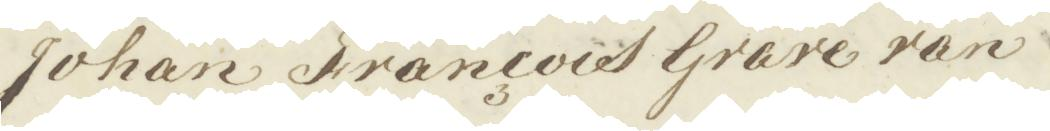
Johan François Grave van
